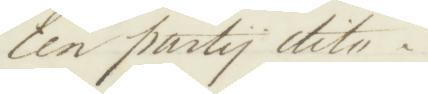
Een partij dito
